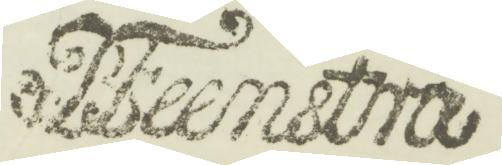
PFeenstra
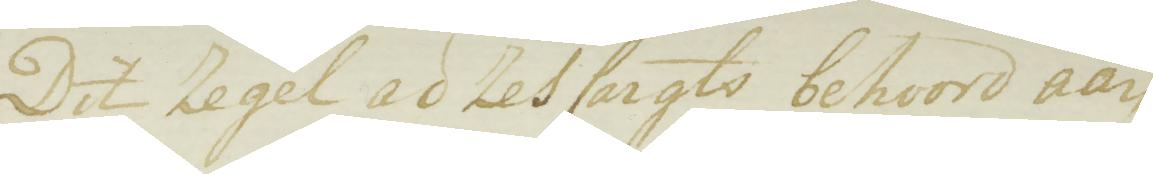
Dit zegel ad zes Car gls behoord aan
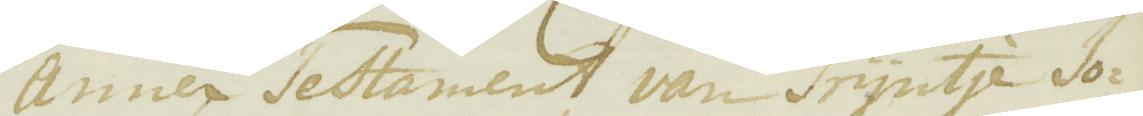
Annex Testament van Trijntje Io
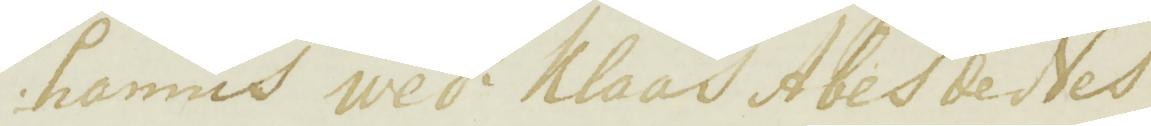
hannis wed„e Klaas Abes de Nes
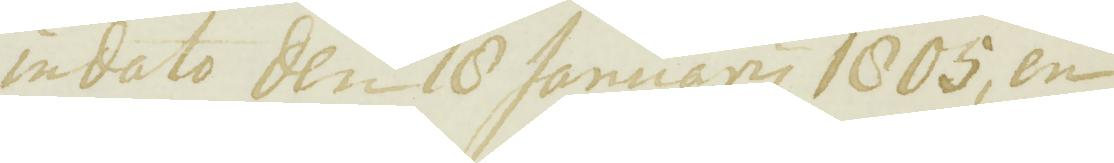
in dato den 18 Januarij 1805, en
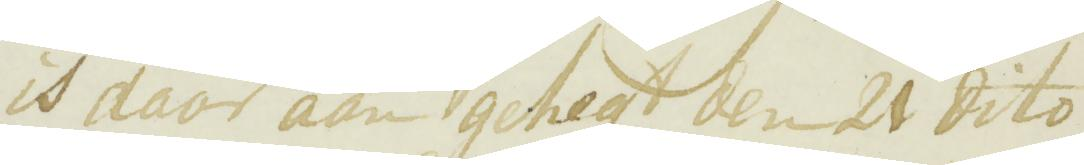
is daar aan gehegt den 21 dito
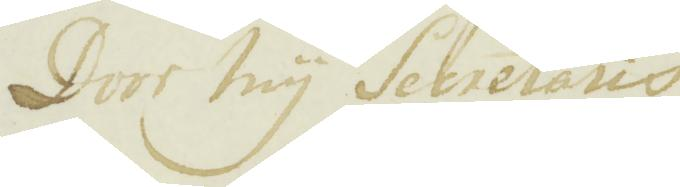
Door mij Secretaris
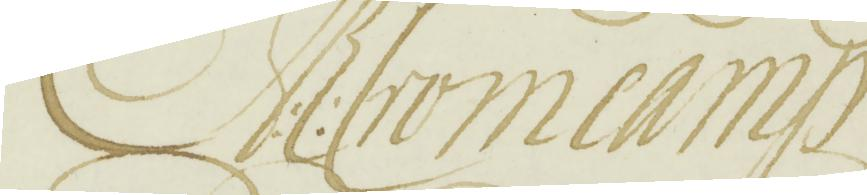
R: Cromcamp
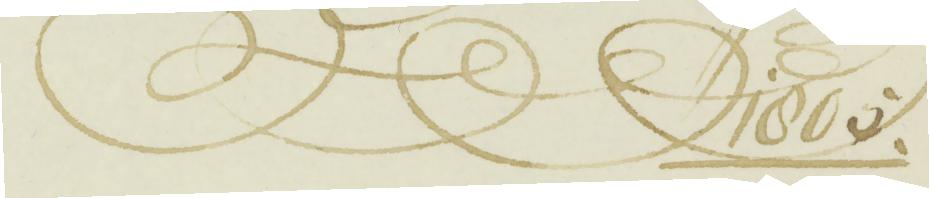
1805.
